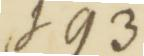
193
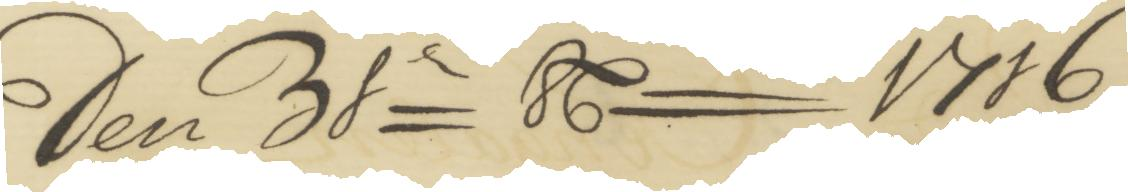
den 31=en 8b=r 1716.
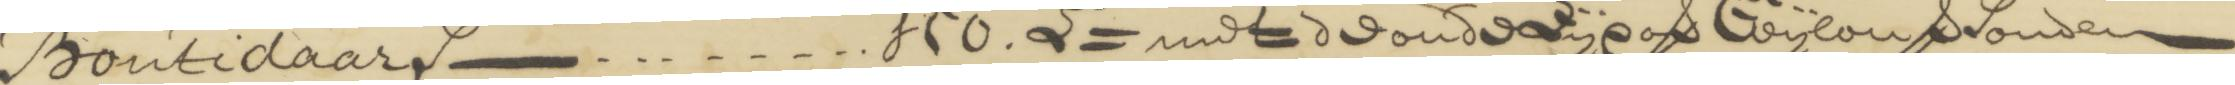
Boutidaars — - - - - - - - - 150. P=s met de oude Zijp over Ceijlon versonden
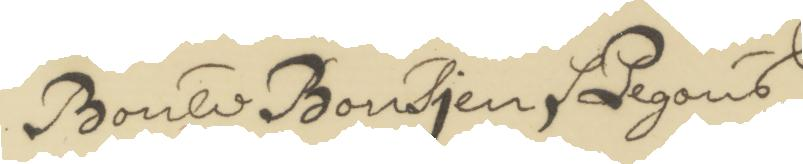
Boule Bousjen Spegous
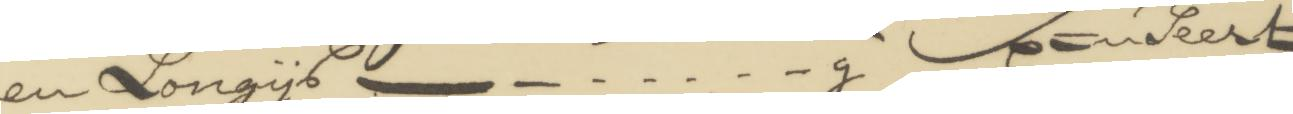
en Longijs — — - - - - - g Excuseert
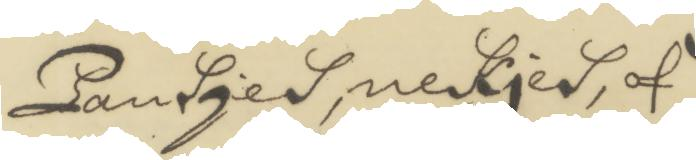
Pansjes, neskjes, of
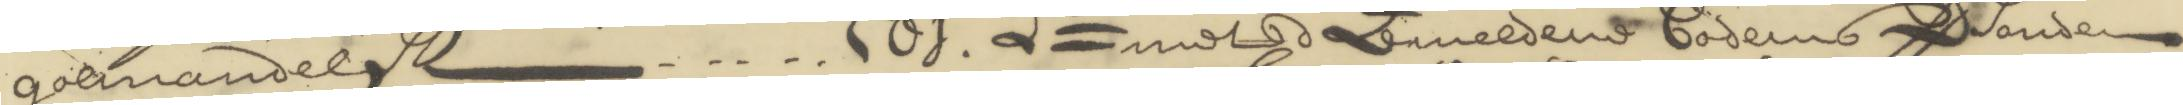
goemandels — - - - - - 501. P=s met d' tweedene bodems versonden
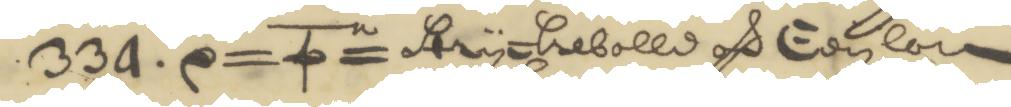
334. p=s p=r strijckebolle over Ceijlon
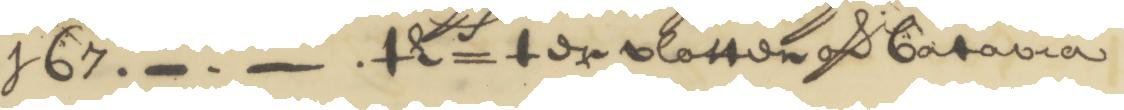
167. —. —. 1h=s ter vlotten over batavia
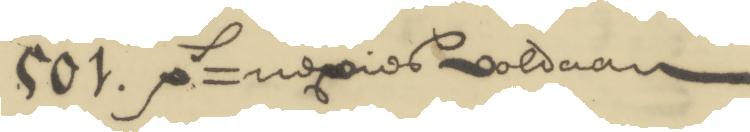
501. p=s nepies voldaan
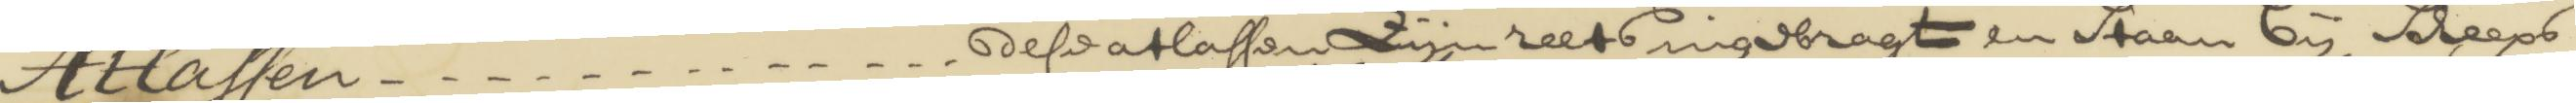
Atlassen - - - - - - - - - - - - - dese atlassen Zijn reets ingebragt en staan bij scheeps
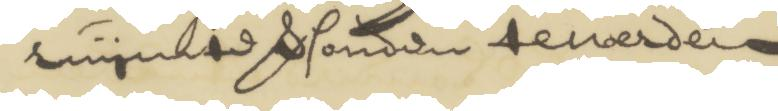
ruijmte versonden tewerden
